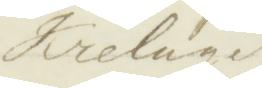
Krelage
